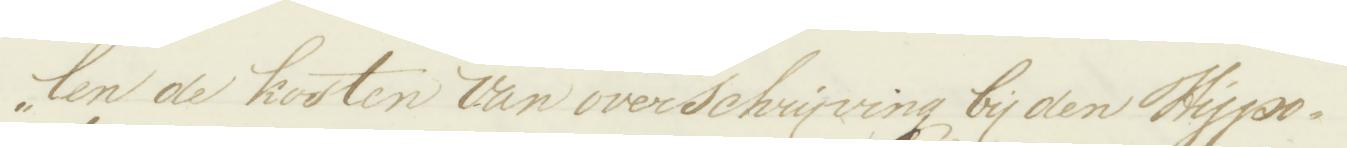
„len de kosten van overschrijving bij den Hijpo„
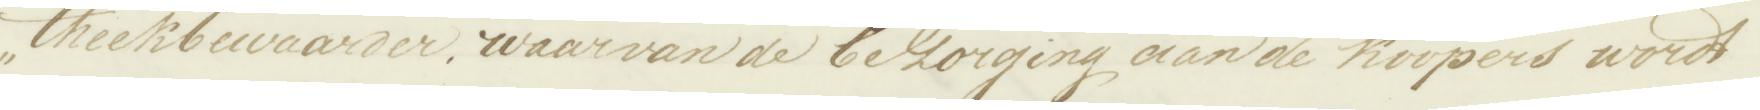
„theekbewaarder, waar van de bezorging aan de Koopers wordt
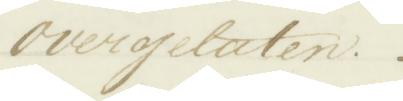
overgelaten.
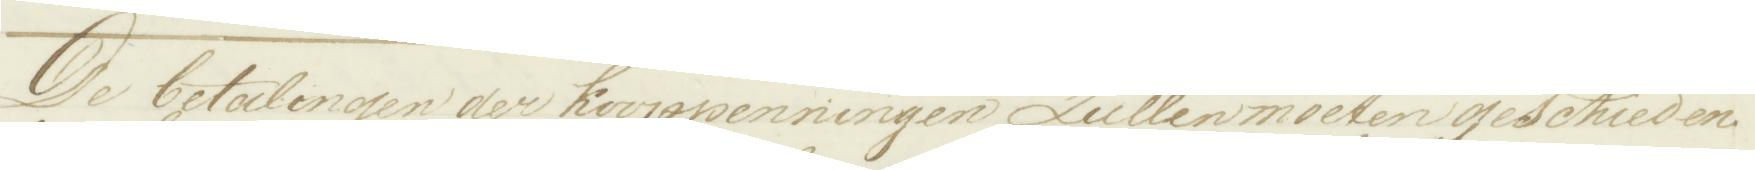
De betalingen der kooppenningen zullen moeten geschieden
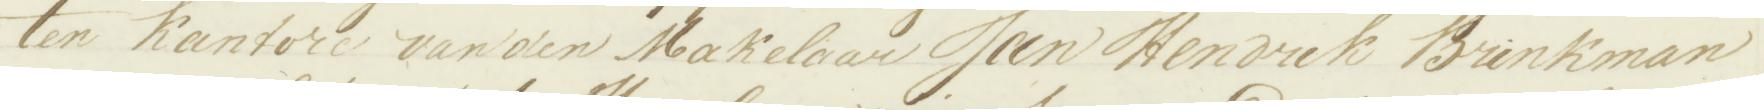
ten kantore van den Makelaar Jan Hendrik Brinkman
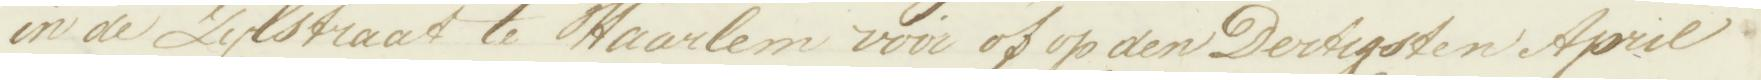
in de Zylstraat te Haarlem voor of op den Dertigsten April
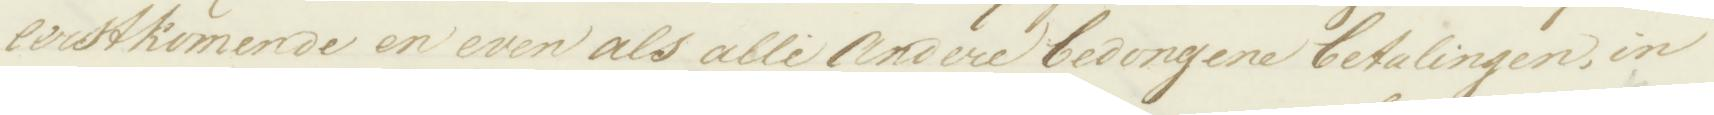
eerstkomende en even als alle andere bedongene betalingen, in
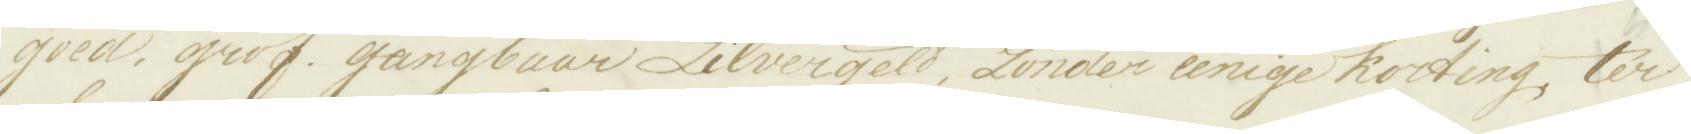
goed, grof. gangbaar Zilvergeld, zonder eenige korting, ter
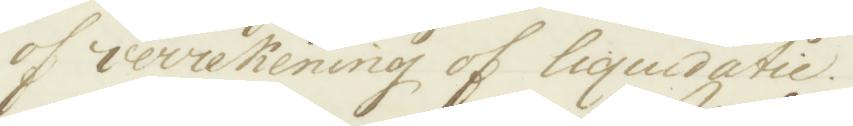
of verrekening of liquidatie.
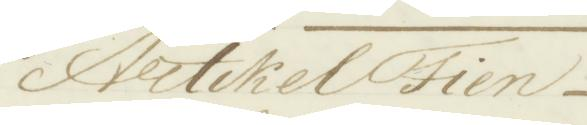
Artikel Tien-
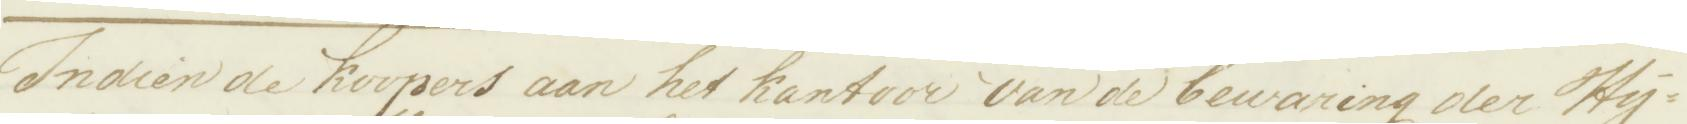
Indien de koopers aan het kantoor van de bewaring der Hij=
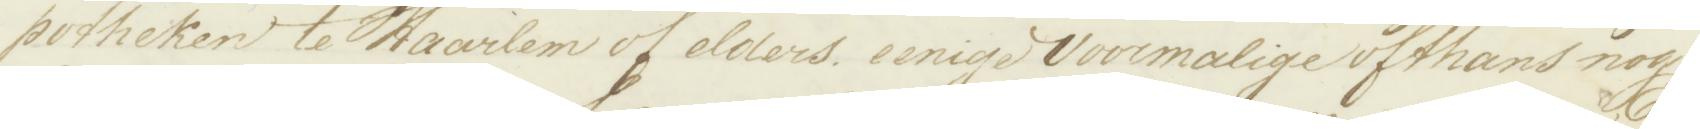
potheken te Haarlem of elders, eenige voormalige ofthans nog
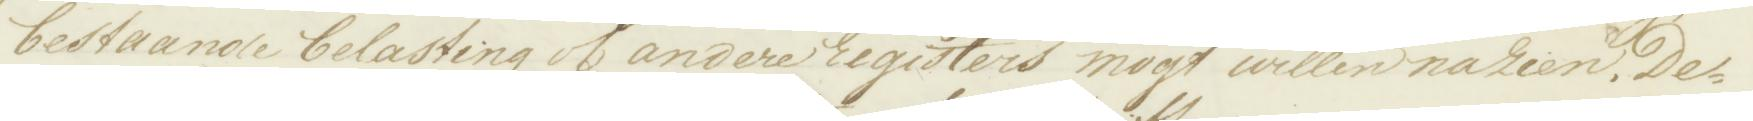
bestaande belasting of andere registers mogt willen nazien, De=
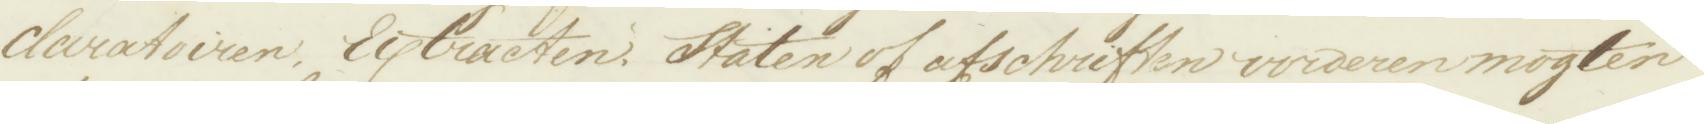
claratoiren, Extracten, staten of afschriften vorderen mogten
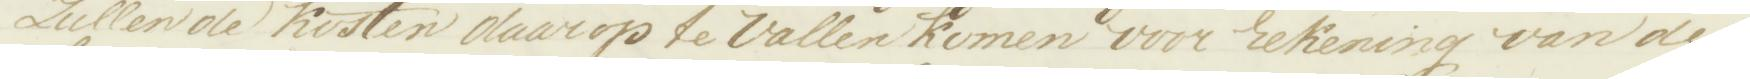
zullen de kosten daarop te vallen komen voor rekening van de
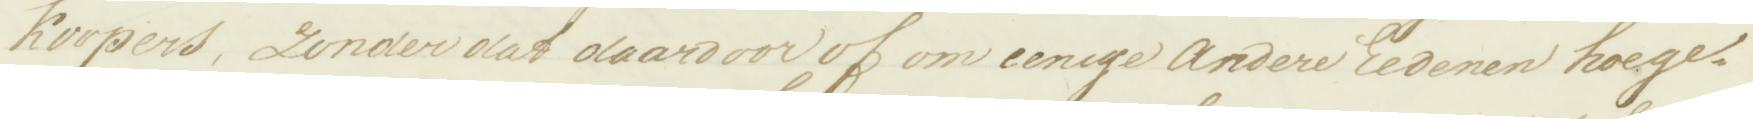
Koopers, zonder dat daardoor of om eenige andere redenen hoege„
